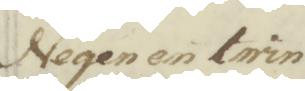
Negen en twin
